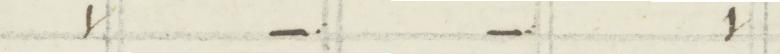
1 —: —: 1
